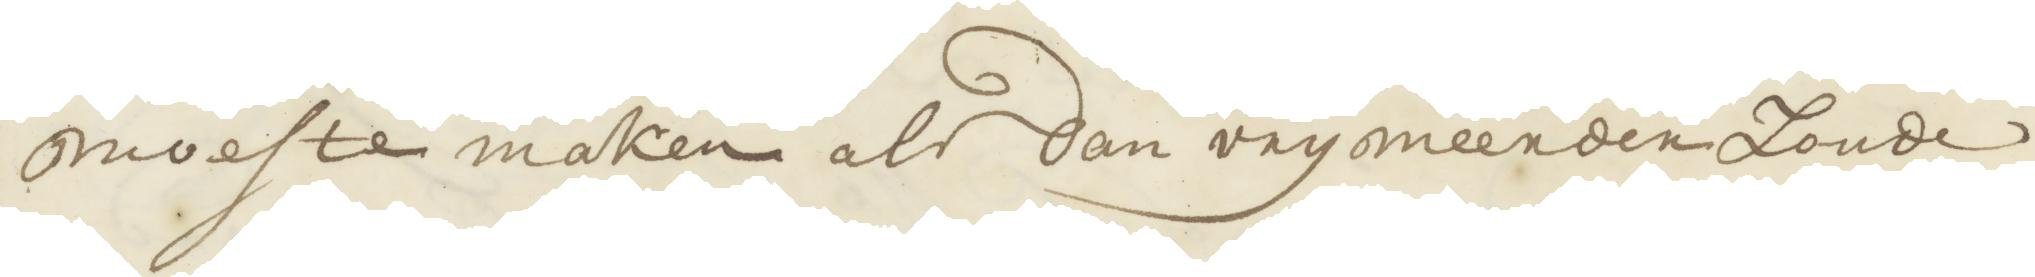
moeste maken alsdan vrij meerder zoude
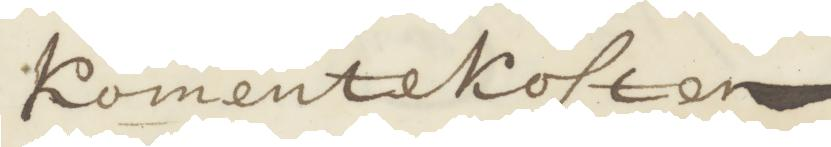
komentekosten
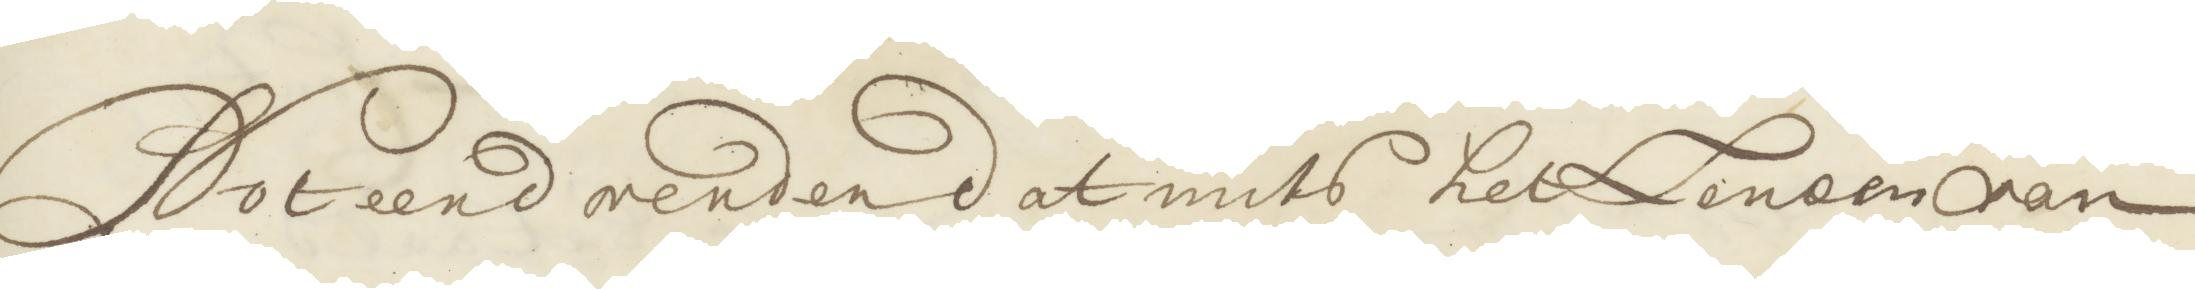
Noteerd verder dat mits het zenden van
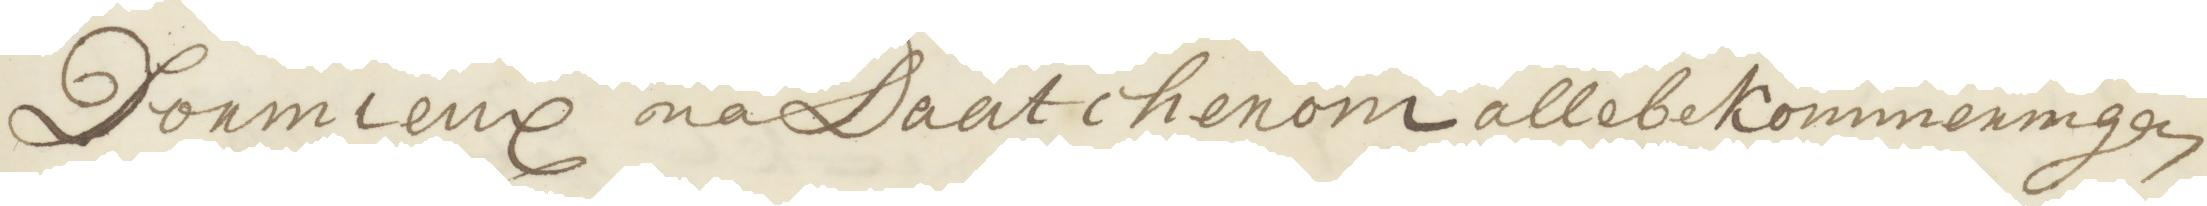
Dormieux na Daatcherom allebekommeringen
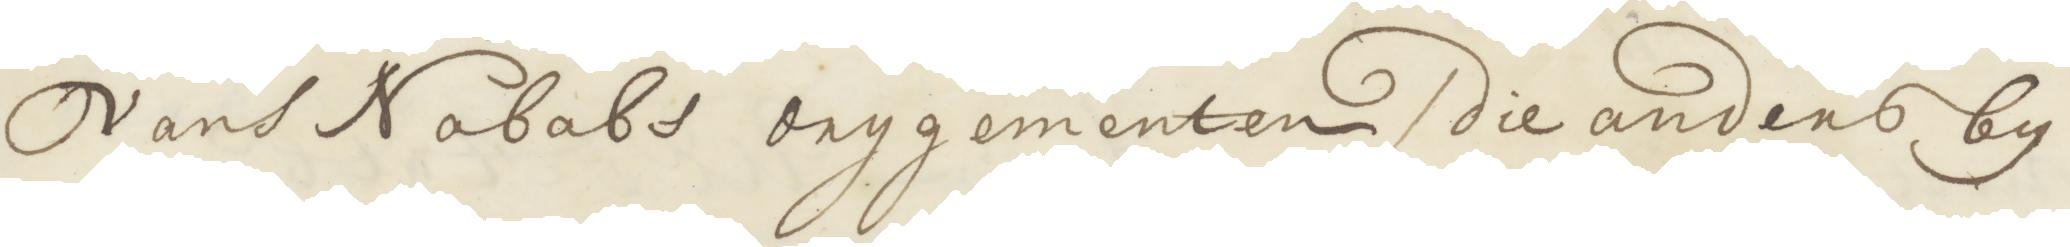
van's Nababs drygementen /die anders by
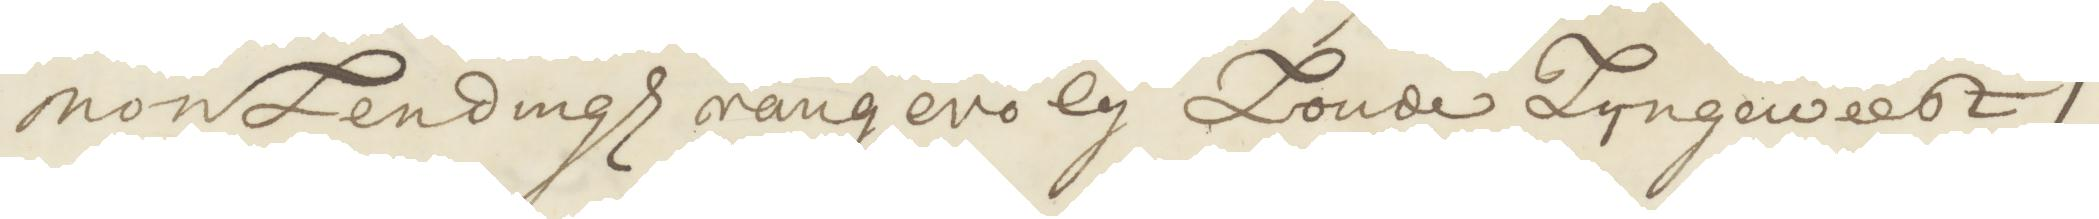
nonzendingen vangevolg zoude zyngeweest/
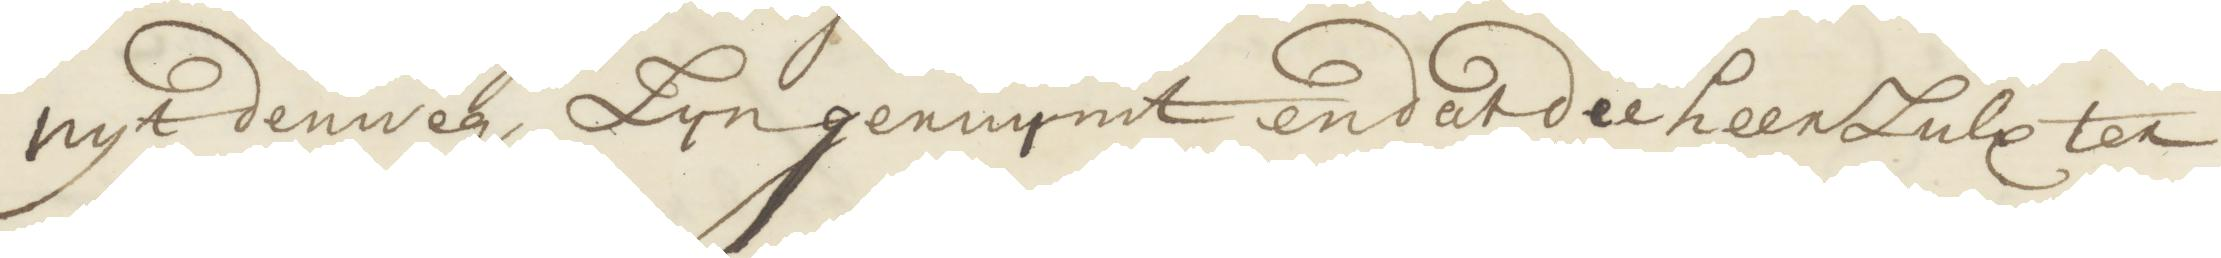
uyt denweg zyn geruymt endatdie heerzulx ter
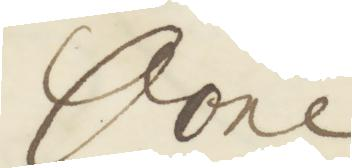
Oore
